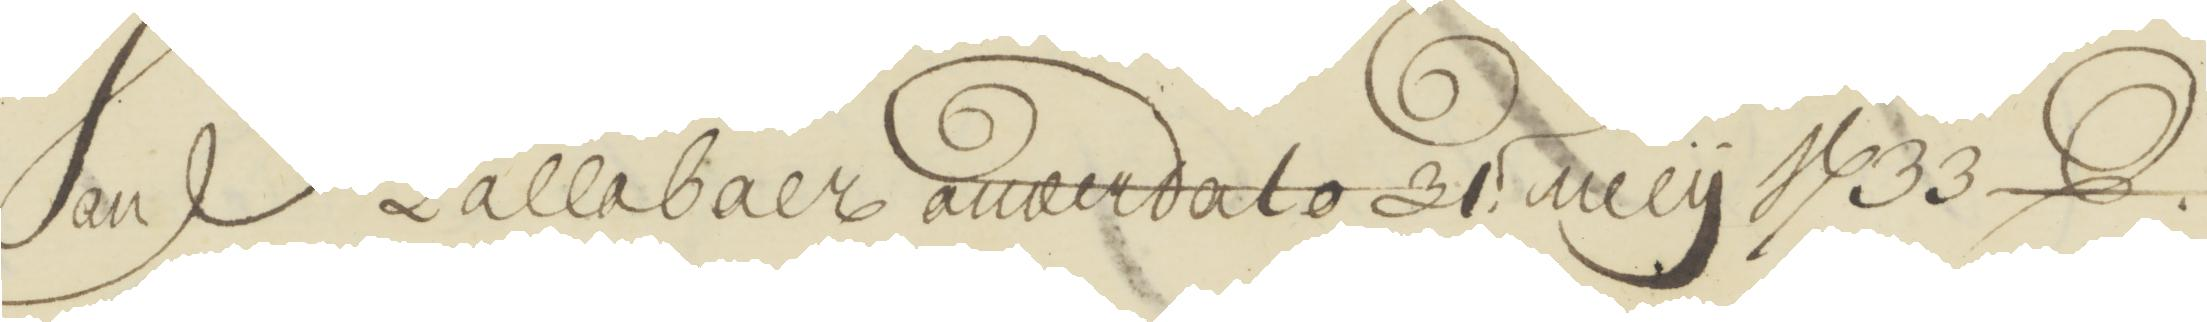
Van Mallabaer onder dato 31:' meij 1733
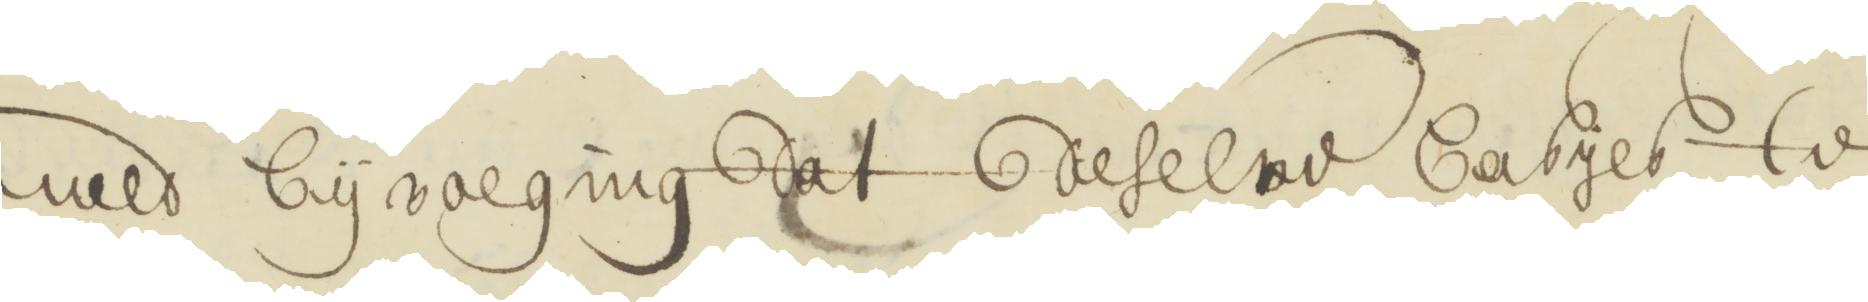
med bij voeging dat deselve casjes te
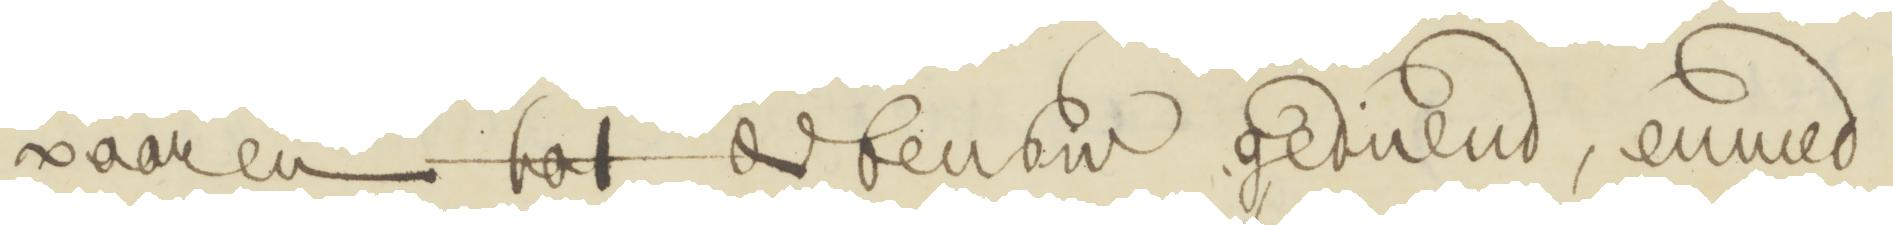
vaeren tot defensie gediend, en med
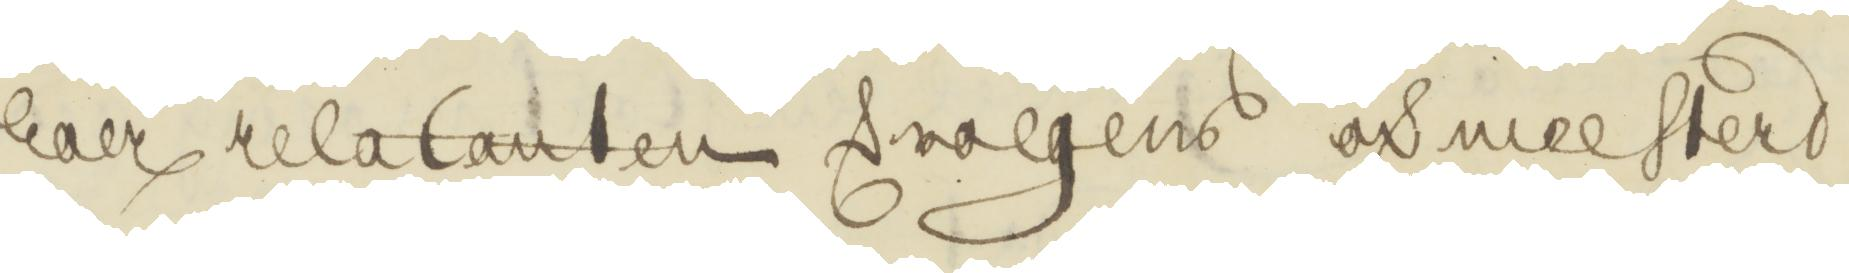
haer relatanten vervolgens overmeesterd
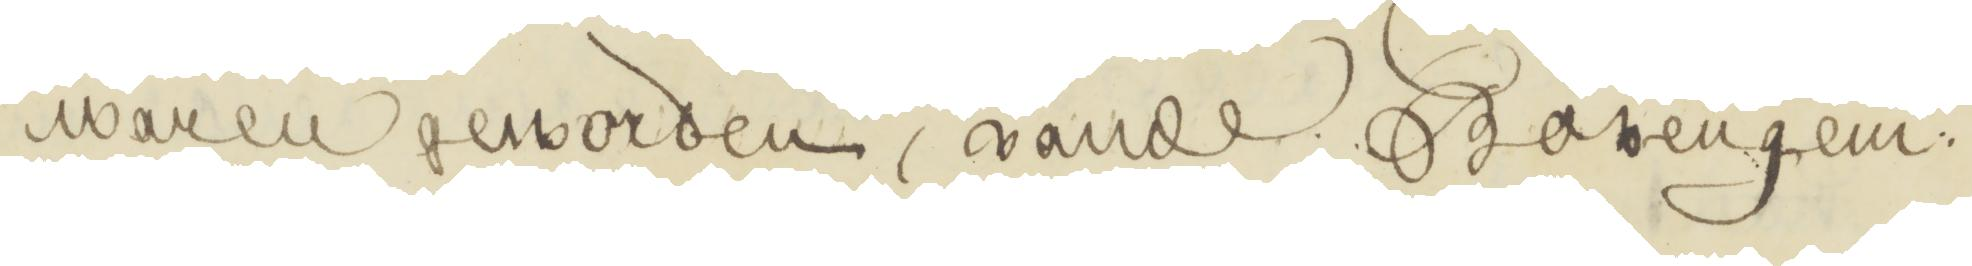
waren geworden, vande Bovengem:
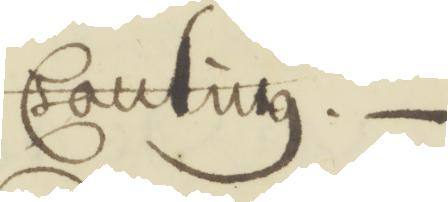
Conting. —
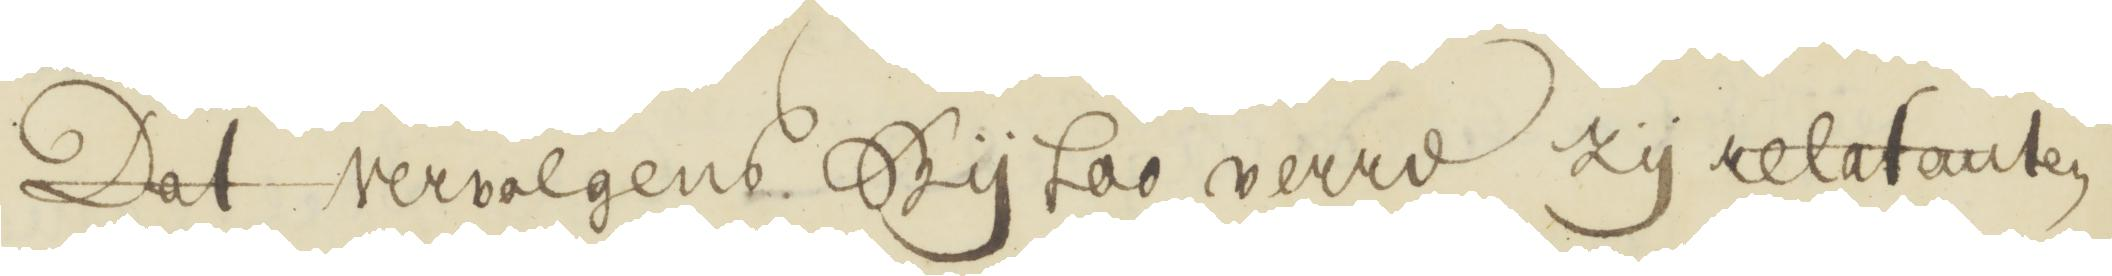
Dat vervolgens Bij soo verre zij relatanten
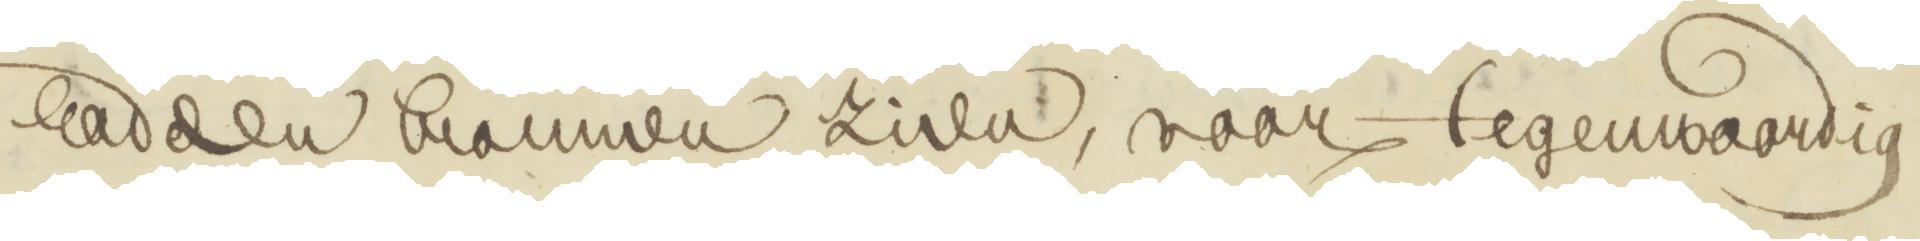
hadden konnen zien, voor tegenwaordig
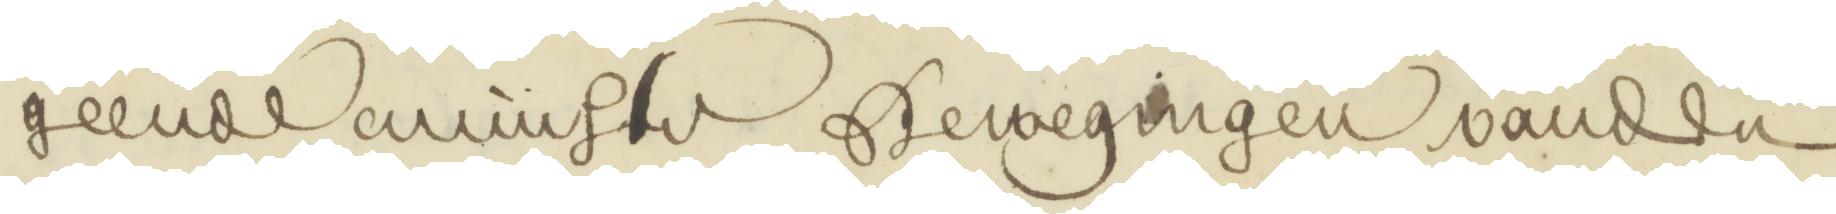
geende minste Bewegengen vanden
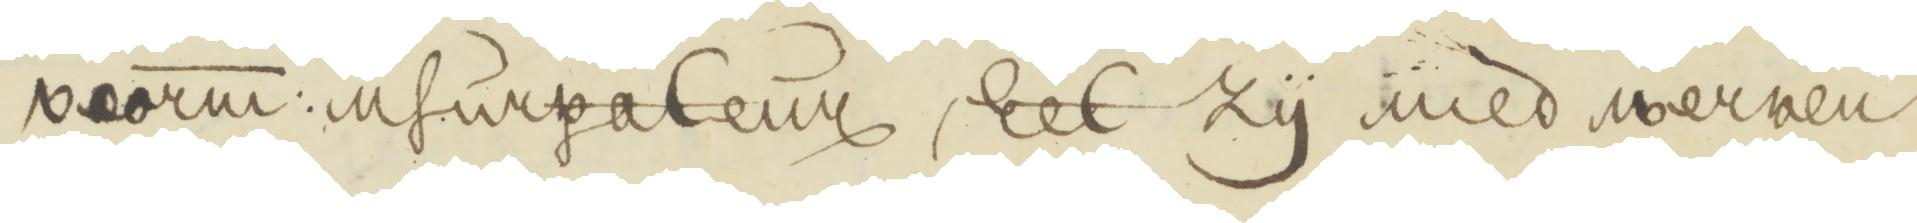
voorm: usurpateur, het zij med werven
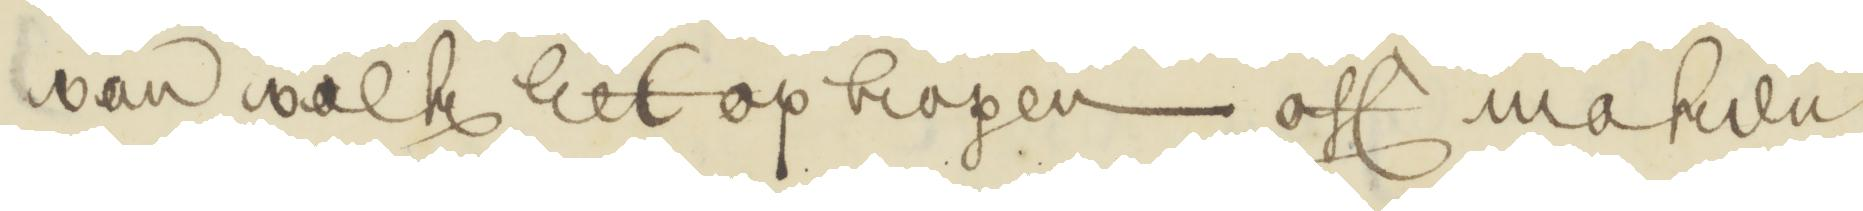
van volk het opkopen off maken
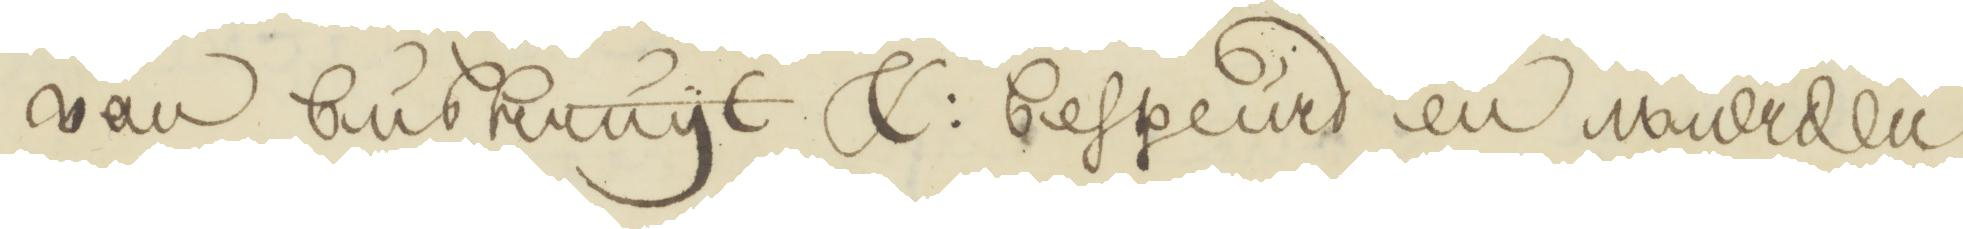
van buskruijt &: bespeurd en wierden
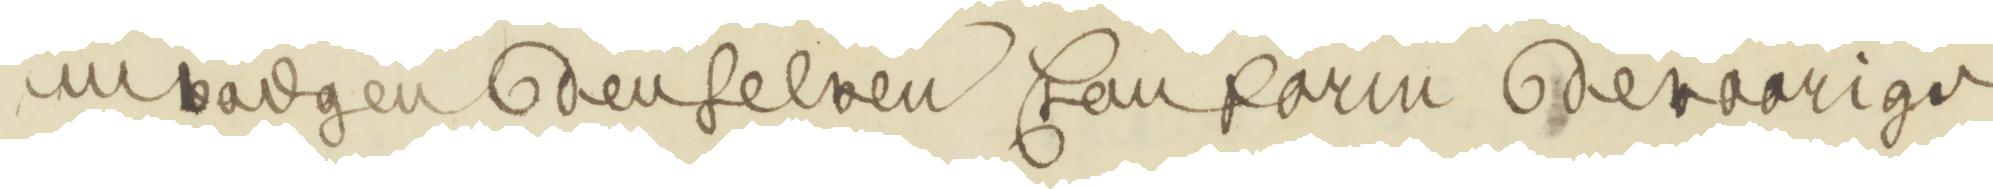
invoegen denselven conform de voorige
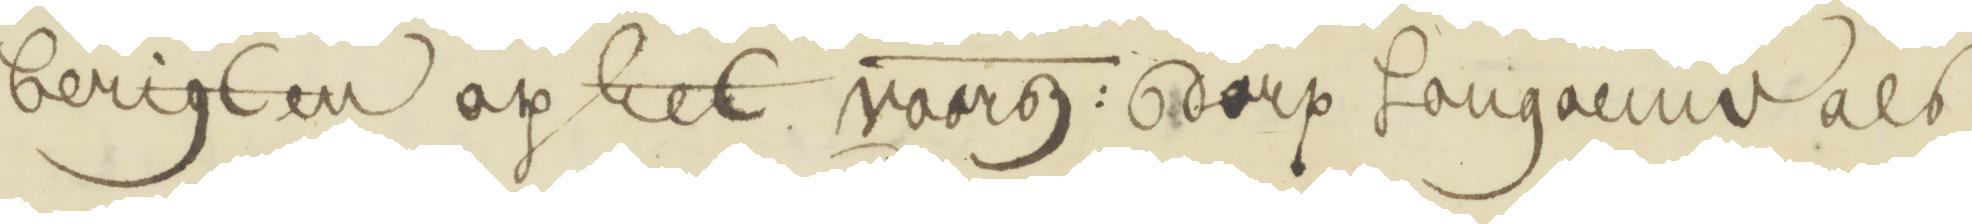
berigten op het voors: dorp songaeme als
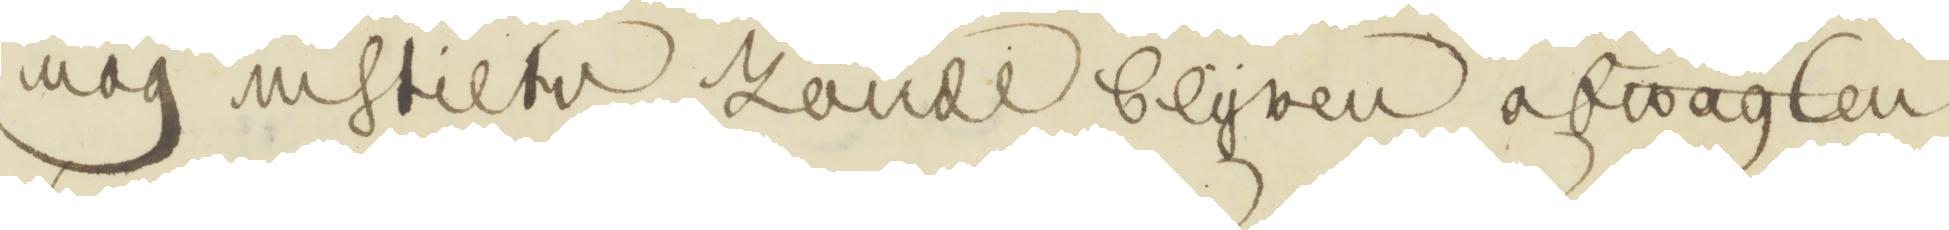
nog instilte zoude blijven afwagten
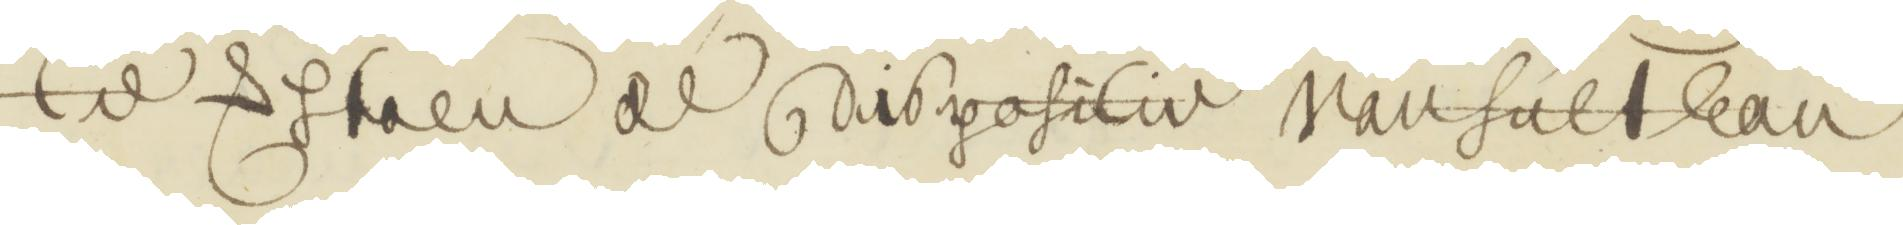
te verstaen de dispositie van sulthan
